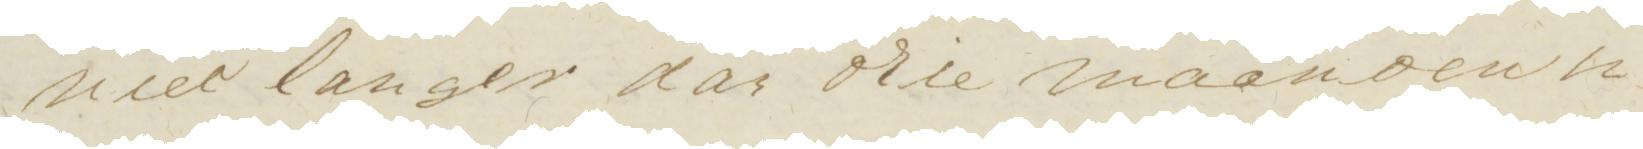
niet langer dan drie maanden in
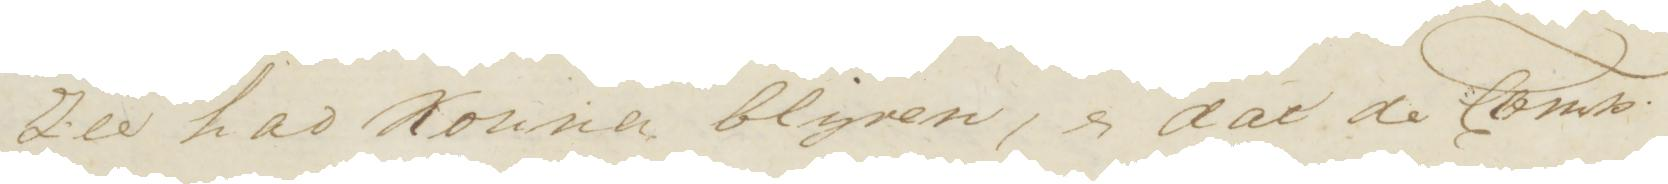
zee had konnen blijven, en dat de Comp.
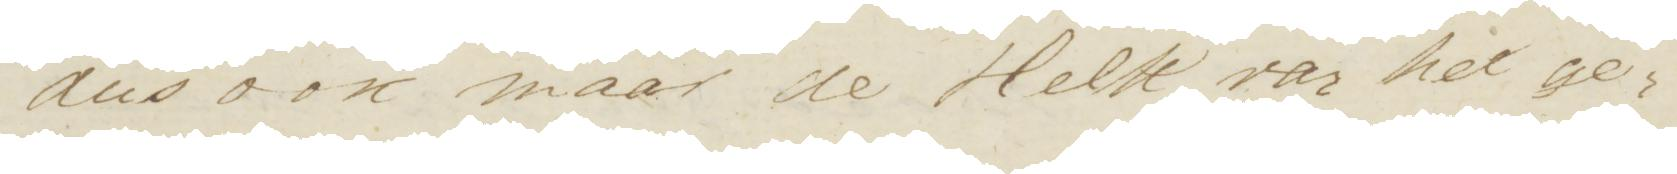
dus ook maar de Helft van het ge„
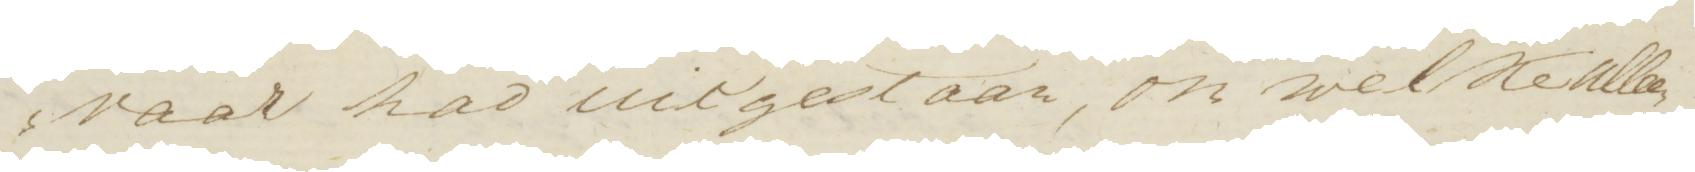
„vaar had uitgestaan, on welke alleen
